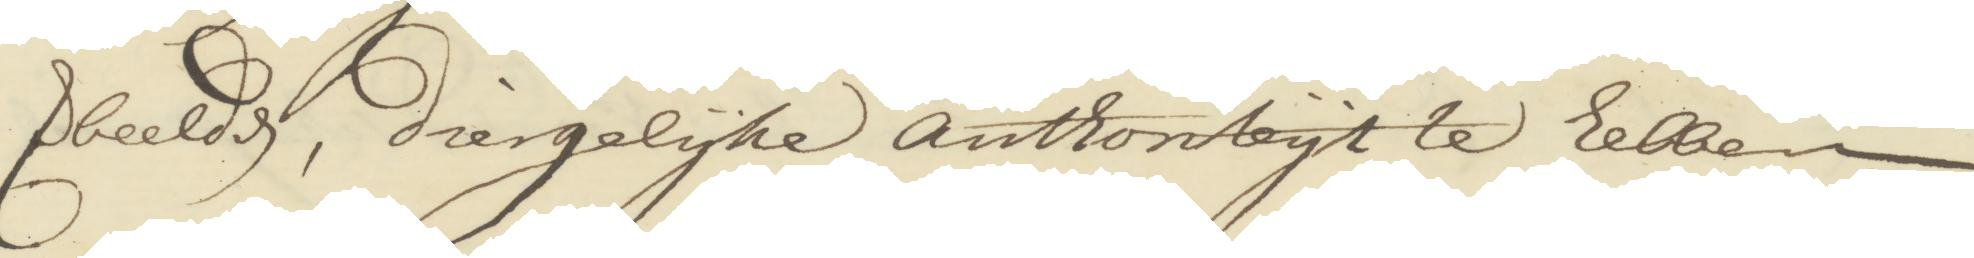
verbeelden, diergelijke anthoriteijt te hebben,
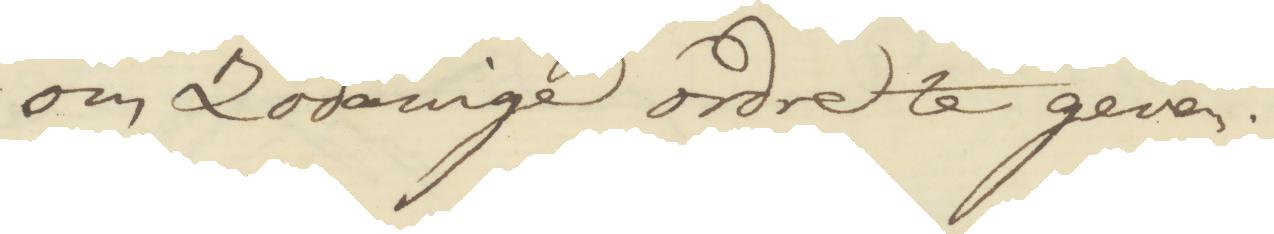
om zodanige ordre te geven.
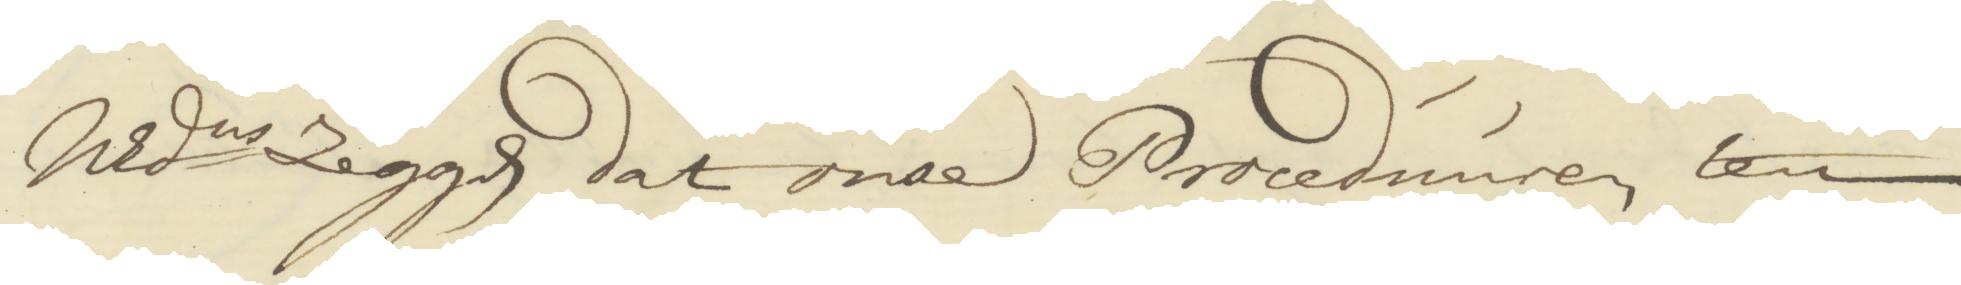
UEd=ns zeggen dat onse Proceduuren ten
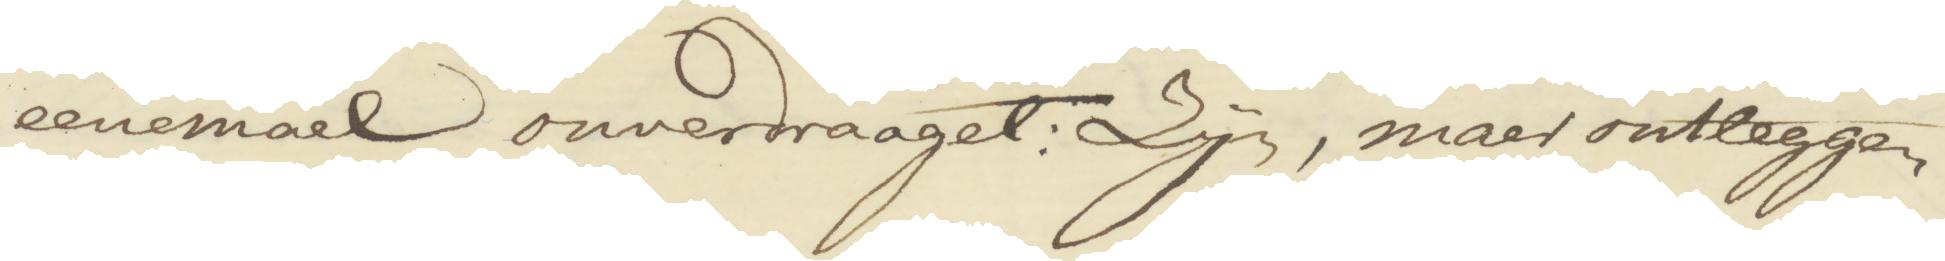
eenemael onverdraagel: zijn, maer ontleggen
